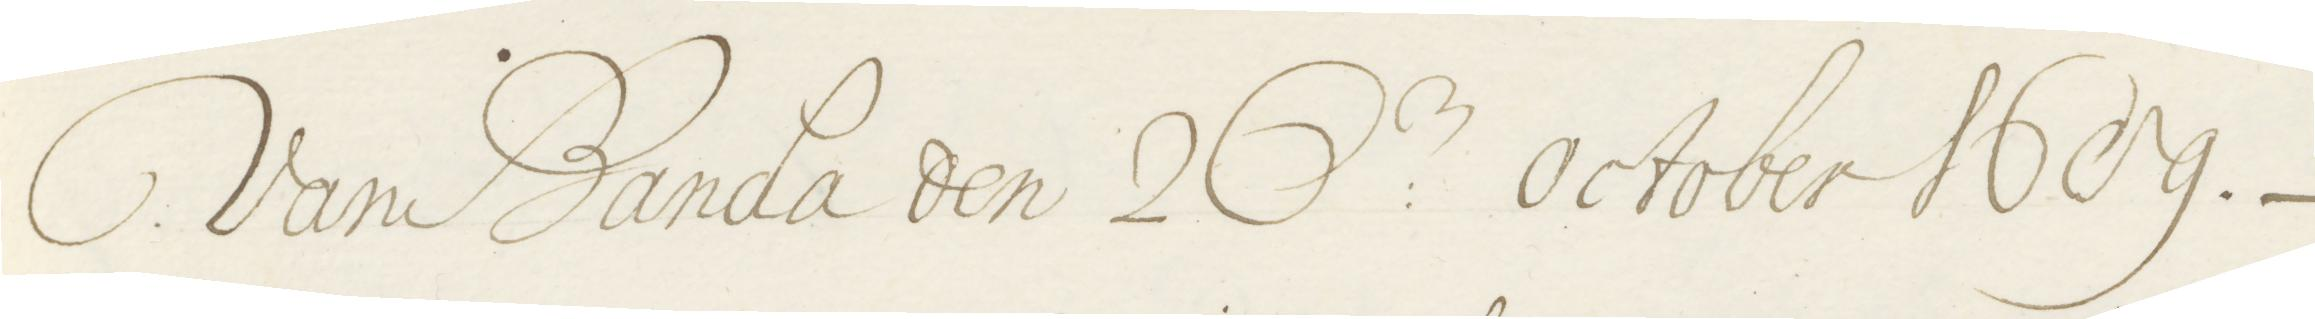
Van Banda den 26:' October 1689.
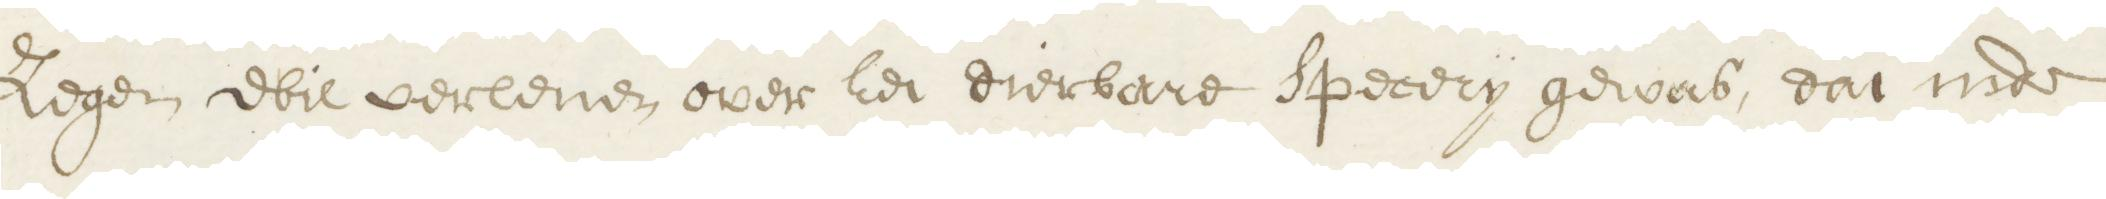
zegen wil verlenen over het dierbare specerij gewas, dat inde
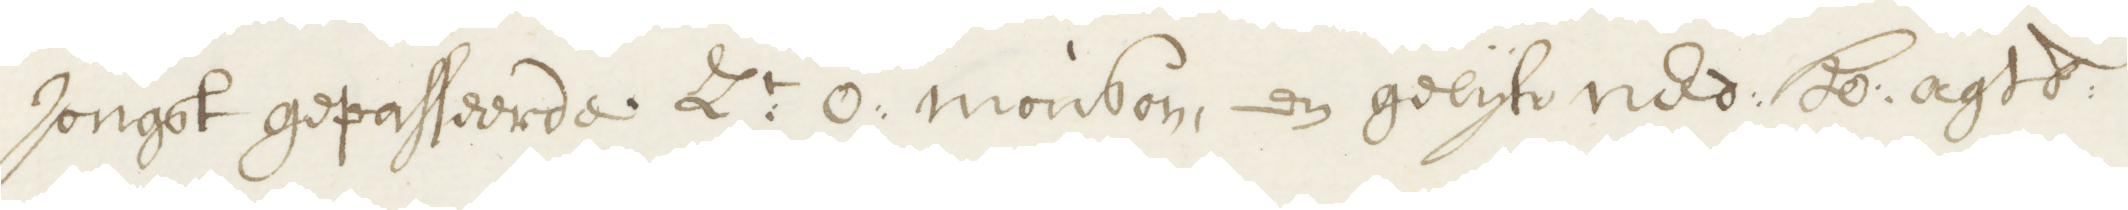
Jongst gepasseerde Z:t O: mouson, en gelijk uEd: Ho: agtb:
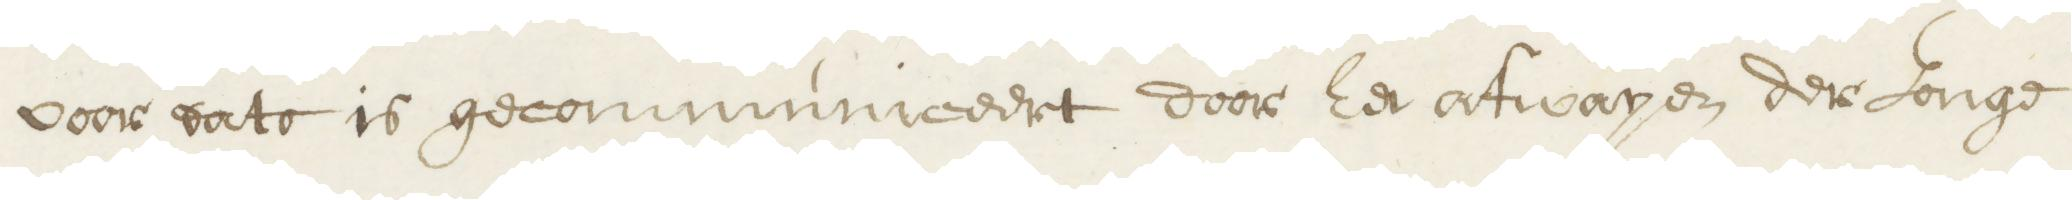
voor dato is gecommuniceert door het afwaijen der Ionge
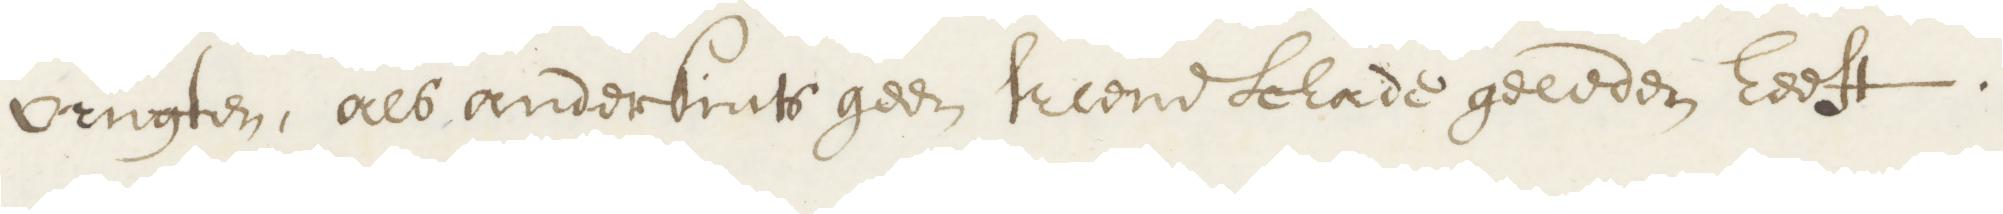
vrugten, als andersints geen klene schade geleden heeft.
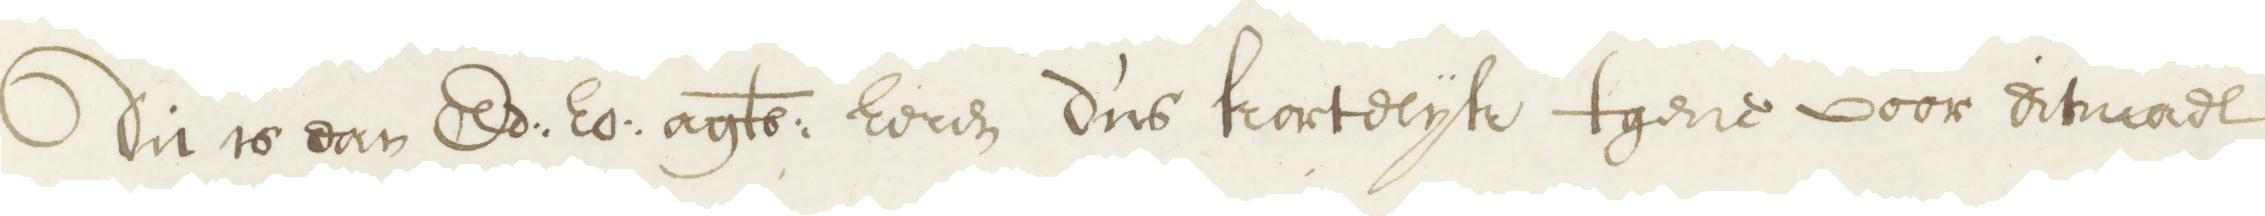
die is dan Ed: ho: agtb: heren dus kortelijk 't gene voor ditmael
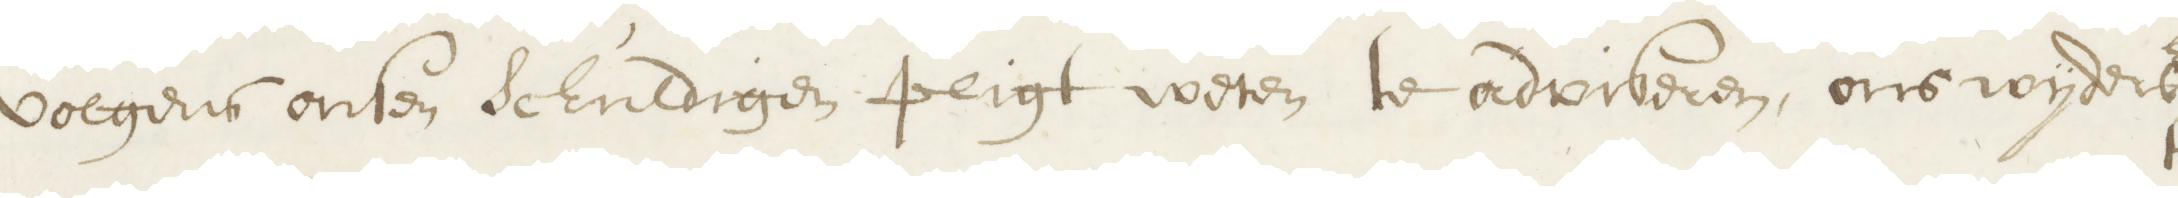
volgens onsen schuldigen pligt weten te adviseren, ons wijders
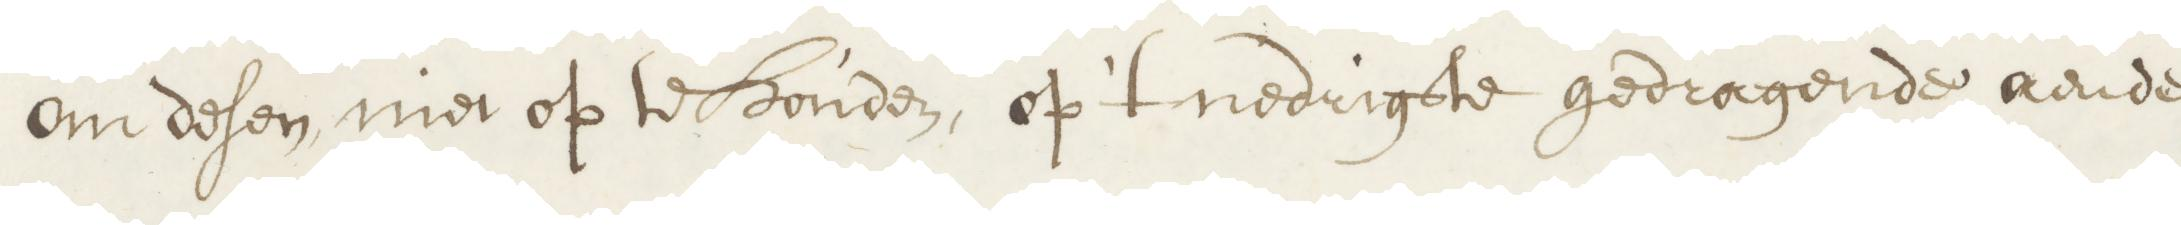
om desen, niet op te houden, op ’t nedrigste gedragende aende
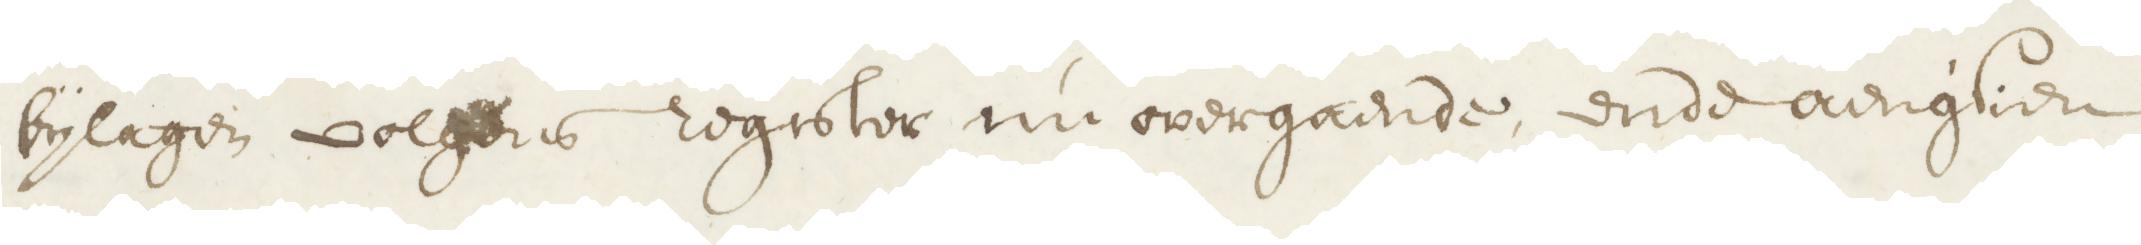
bijlagen volgens register nu overgaende, ende aeng'sien
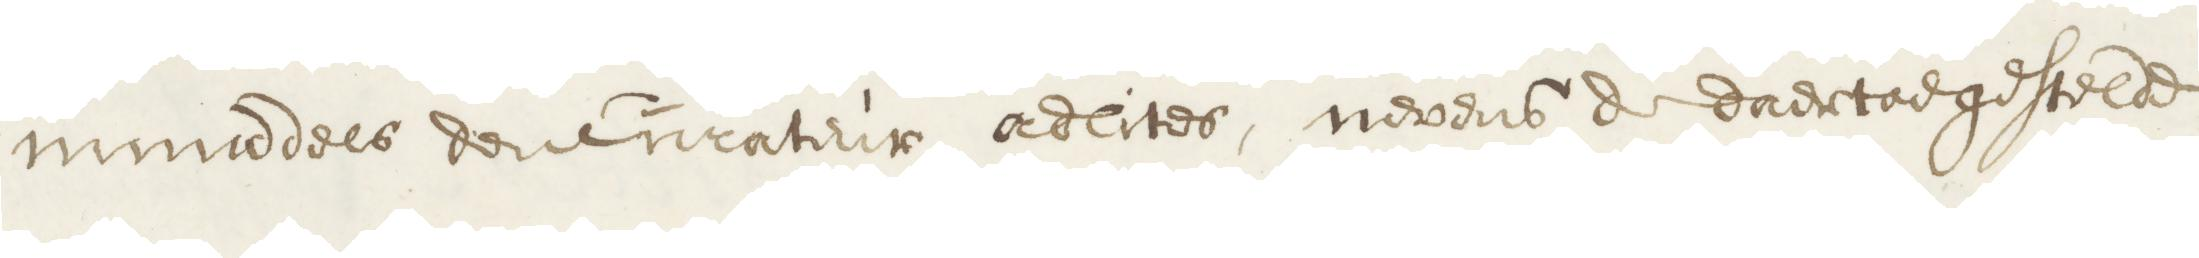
inmiddels den curateur adlites, nevens de daertoegestelde
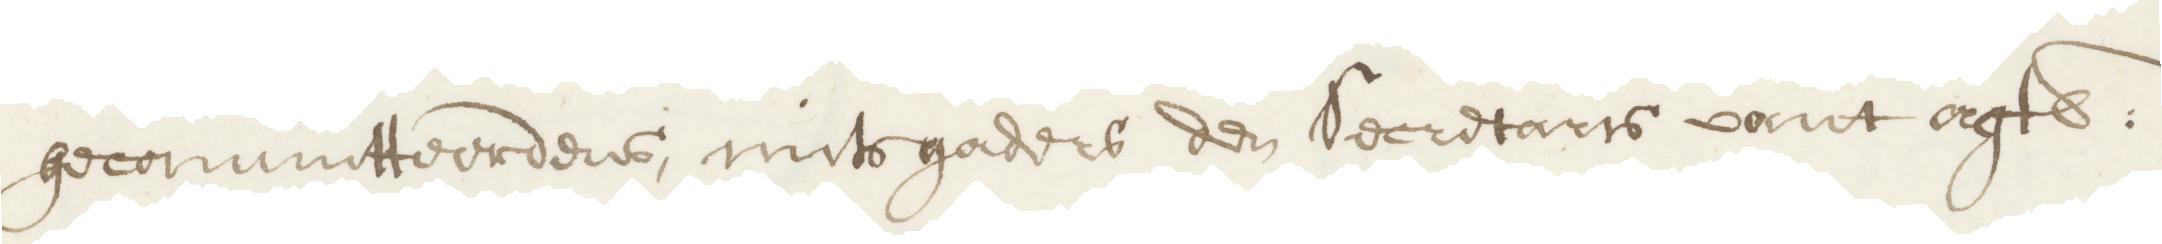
gecommitteerdens, mitsgaders den Secretaris van't agtb:
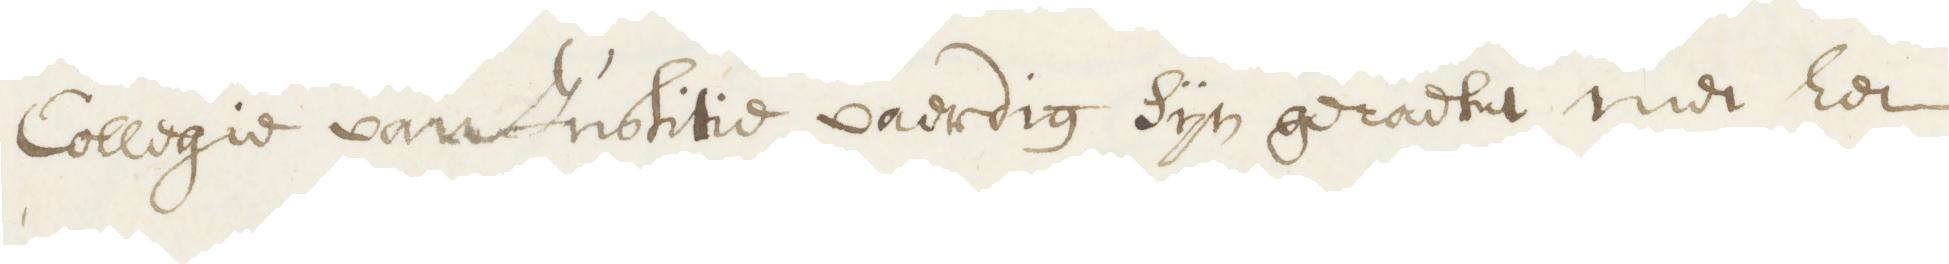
Collegie van Iustitie vaerdig sijn geraekt met het
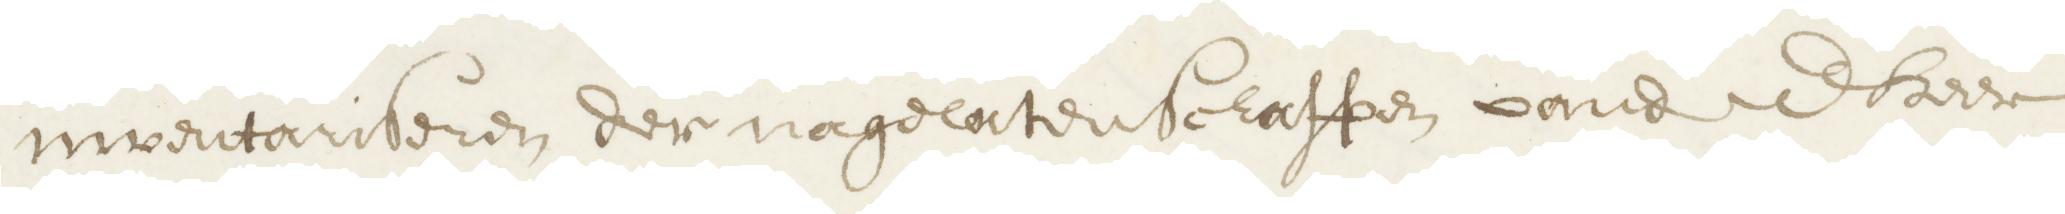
inventariseren der nagelatenschappen vande E Heer
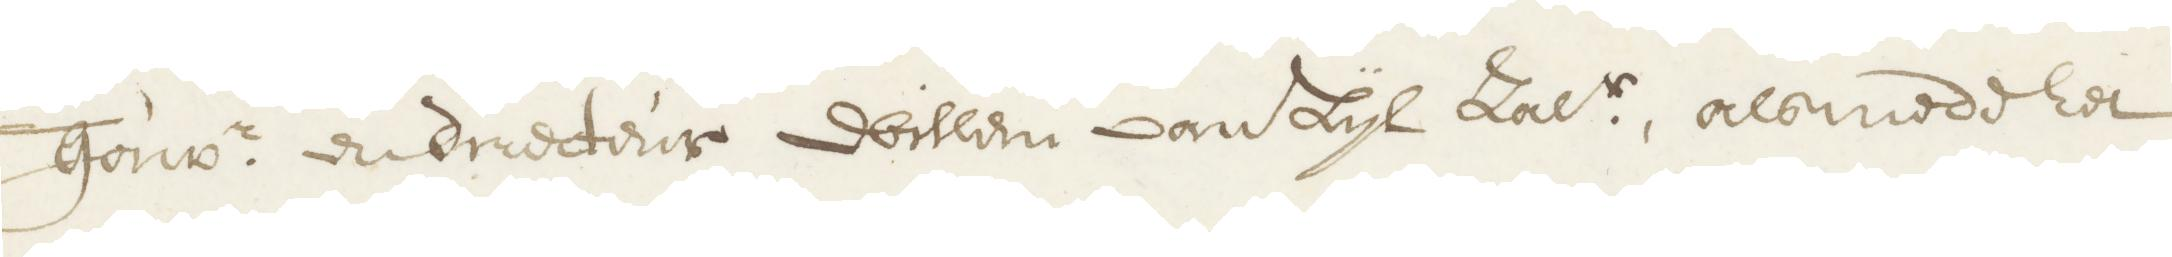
Gouv.r en directeur willem van zijl zal.r, als mede het
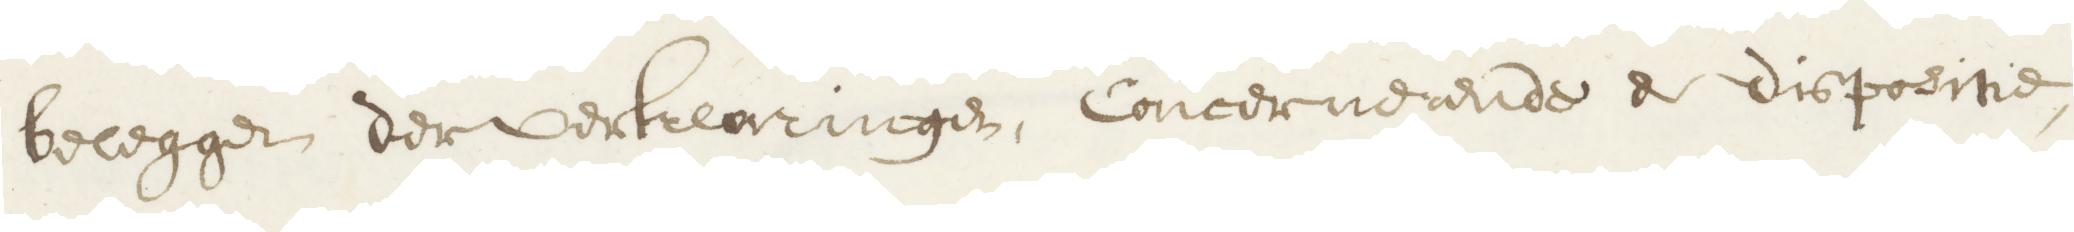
beleggen der verklaringen, concernerende de dispositie
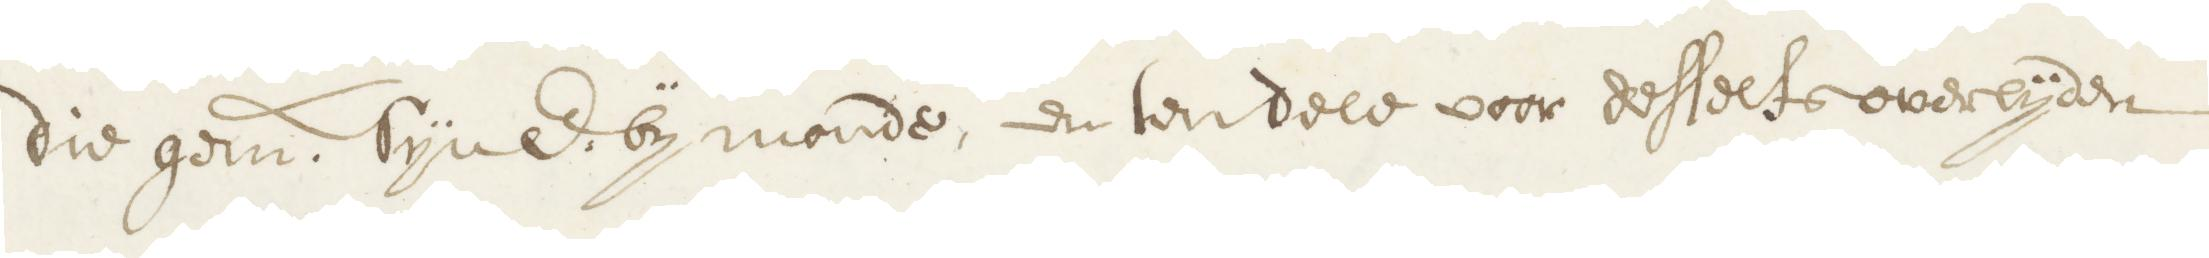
die gem. sijn E. bij monde, en ten dele voor desselfs overlijden
